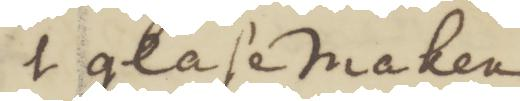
1 glasemaker
